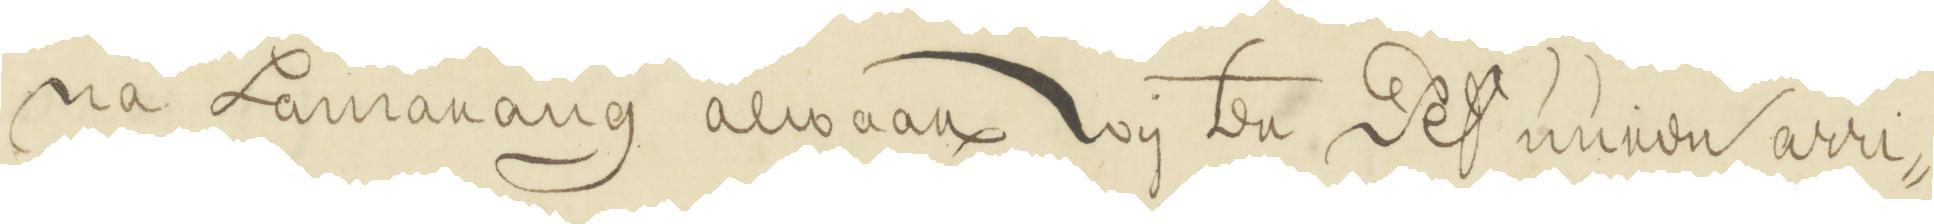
na samarang alwaar wij ter elf uuren arri„
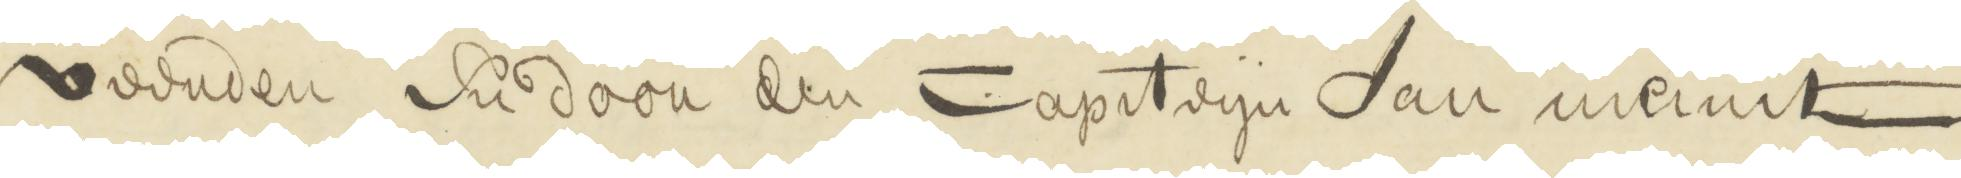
veerden en door den capiteijn Ian menut
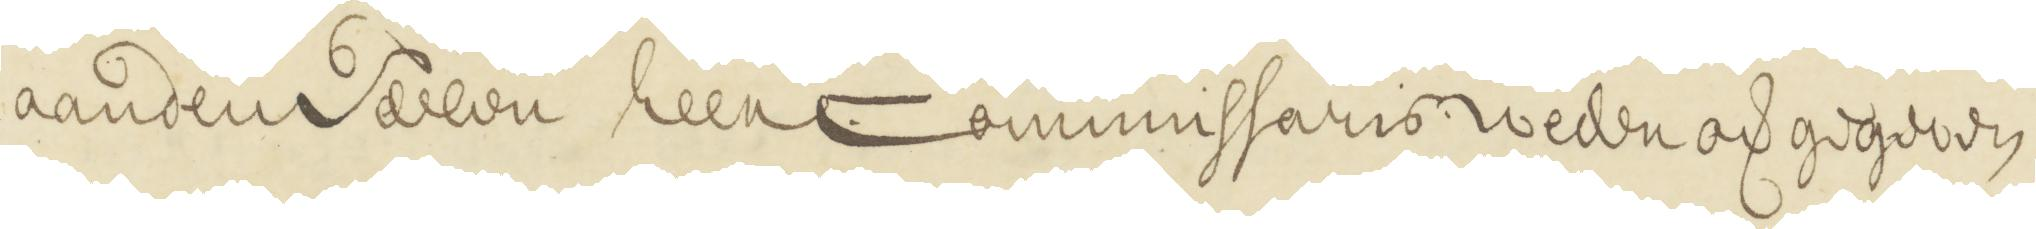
aan den edelen heer commissaris weder overgegeven
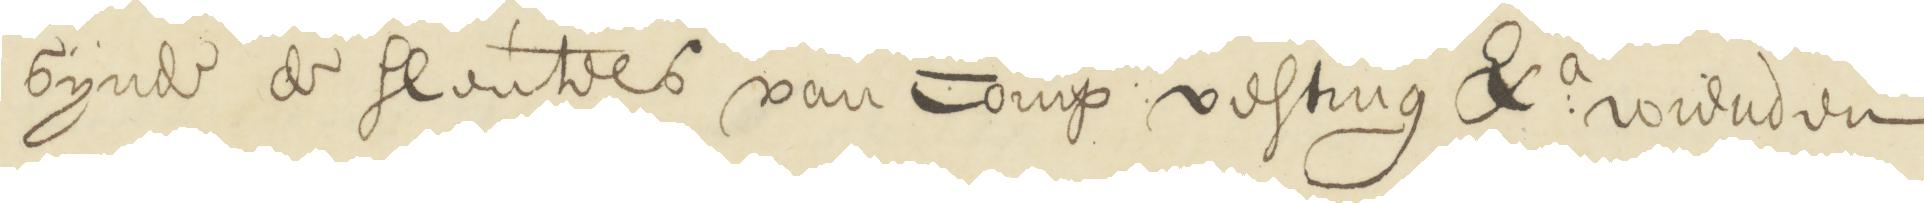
sijnde de sleutels van comp: vesting et:a wierden
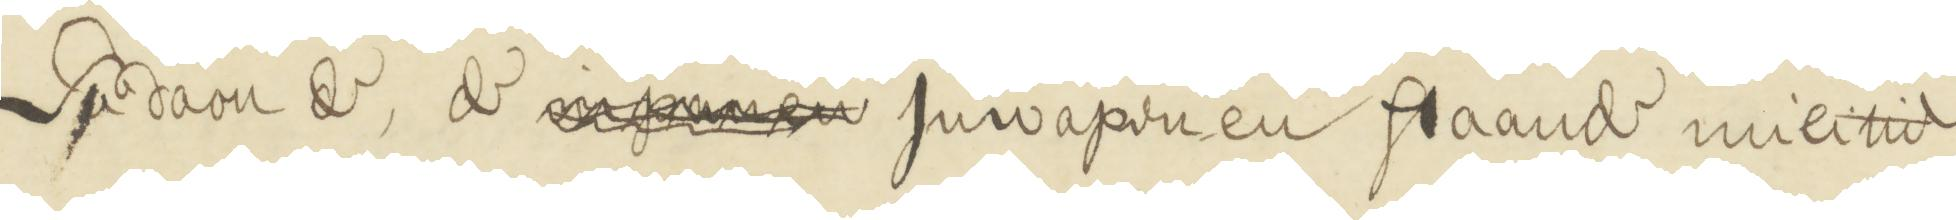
en door de, de inparen jnwapenen staande militie
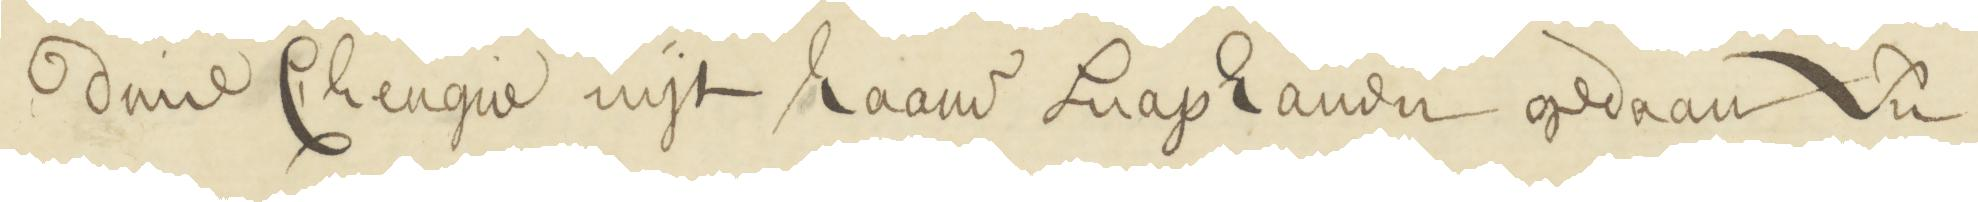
drie Chergie uijt haare snaphanen gedaan en
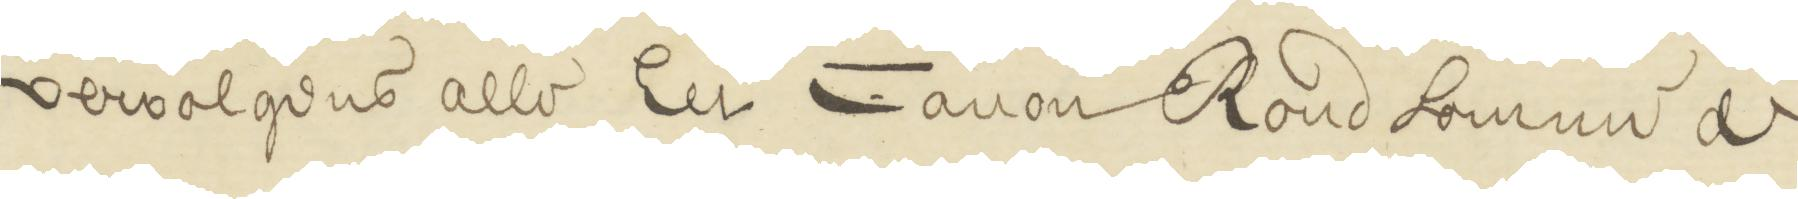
vervolgens alle het canon Rond somme de
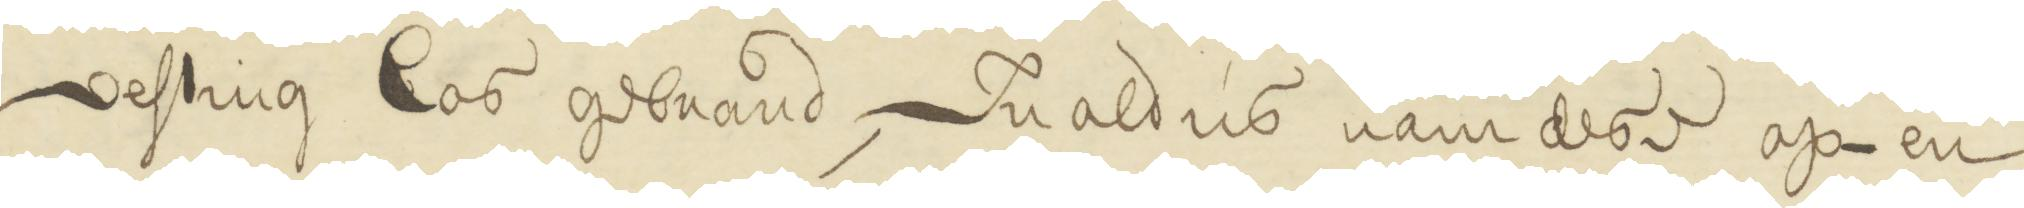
vesting los gebrand, en aldus nam dese op- en
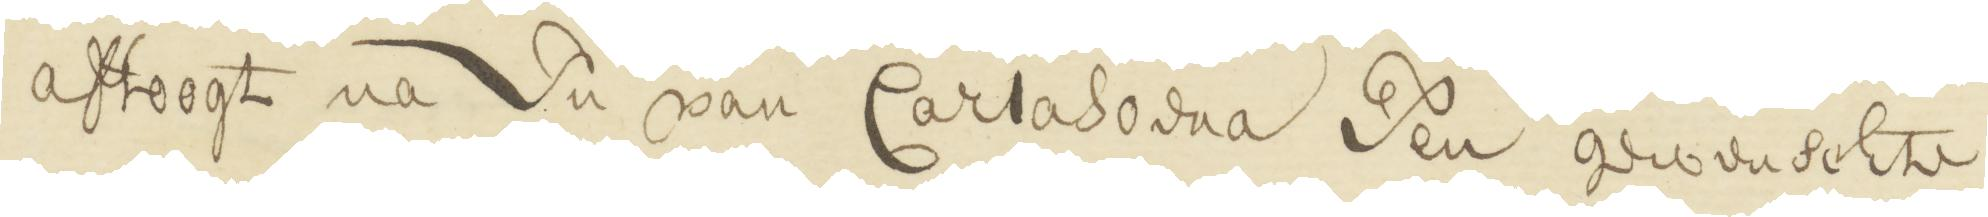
aftoogt na en van Cartasoera een gewenschte
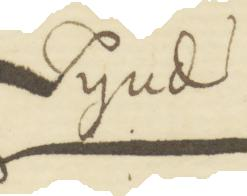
eynde
